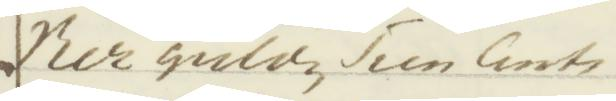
Vier gulden Tien Cents
